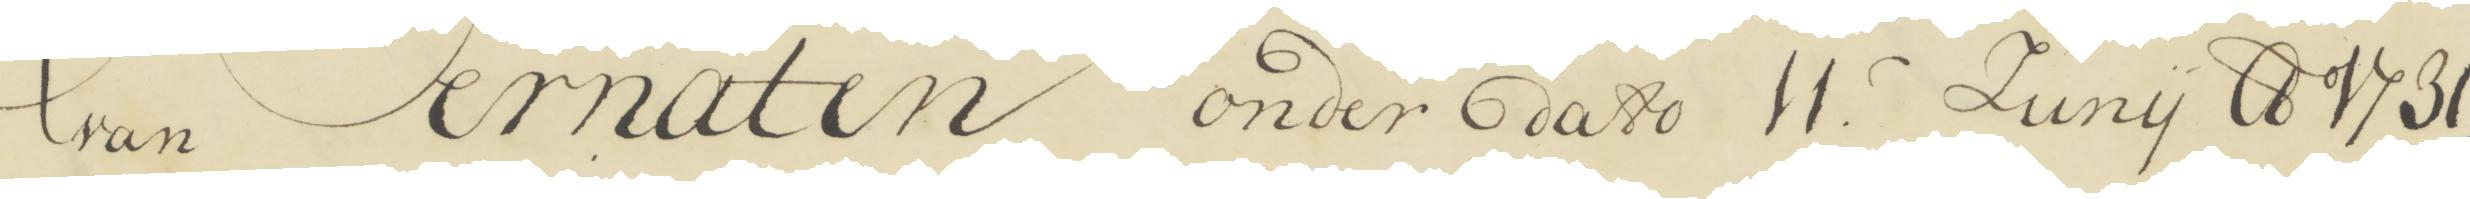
Van Ternaten onder dato 11.' Iunij Ao 1735
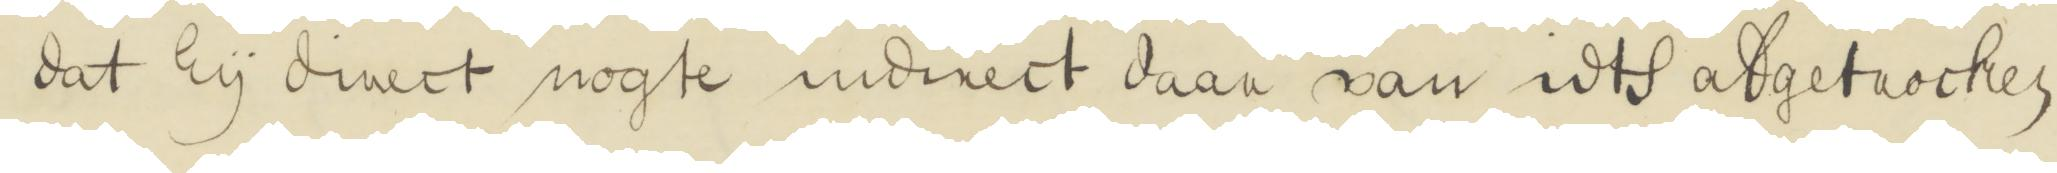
dat hij direct nogte indirect daar van iets afgetrocken
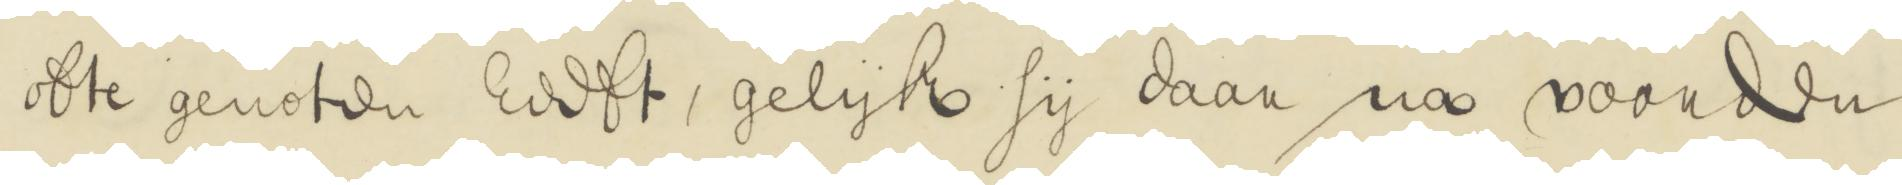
ofte genoten heeft, gelijk sij daar na voor den
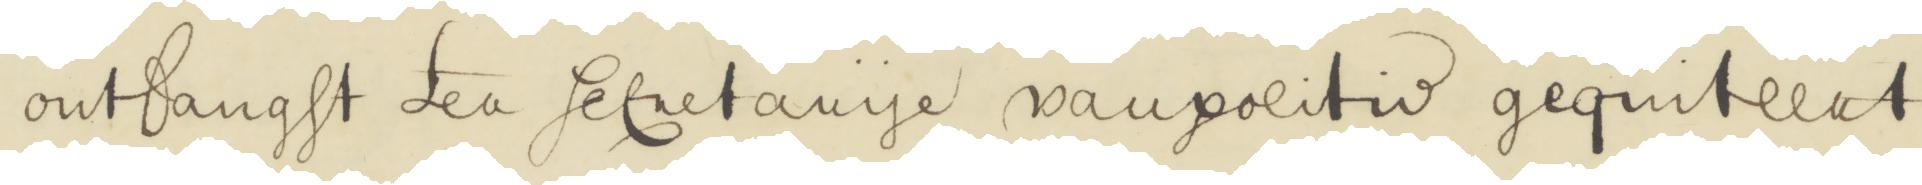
ontfangst ter secretarije van politie gequiteert
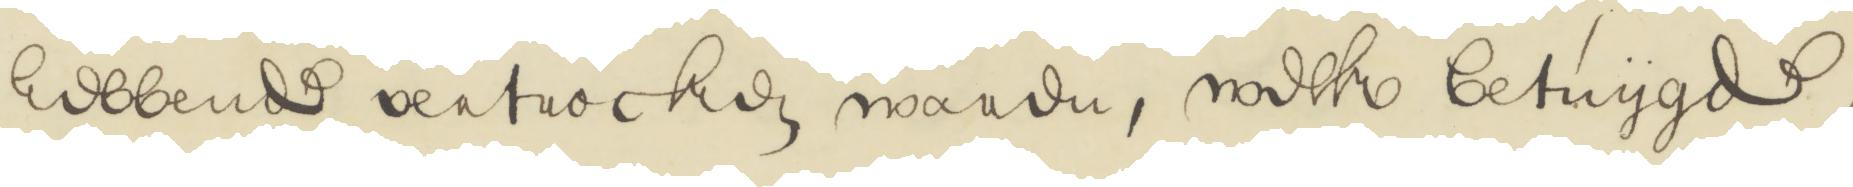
hebbende vertrocken waren, welk betuijgde
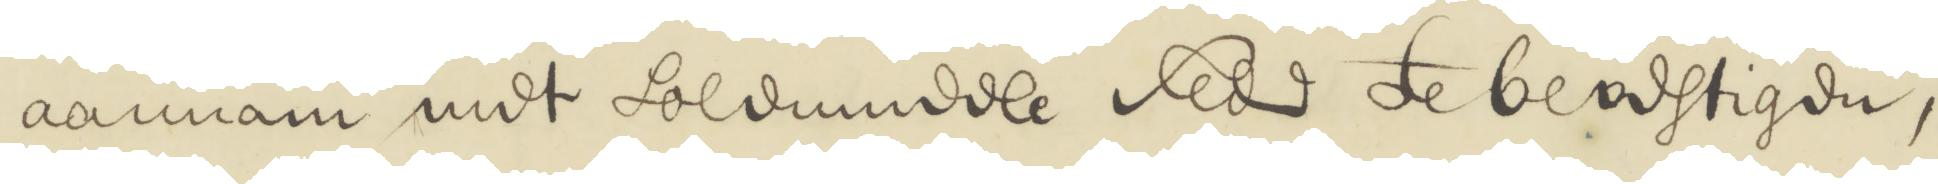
aannam met solemneele Eede te bevestigen
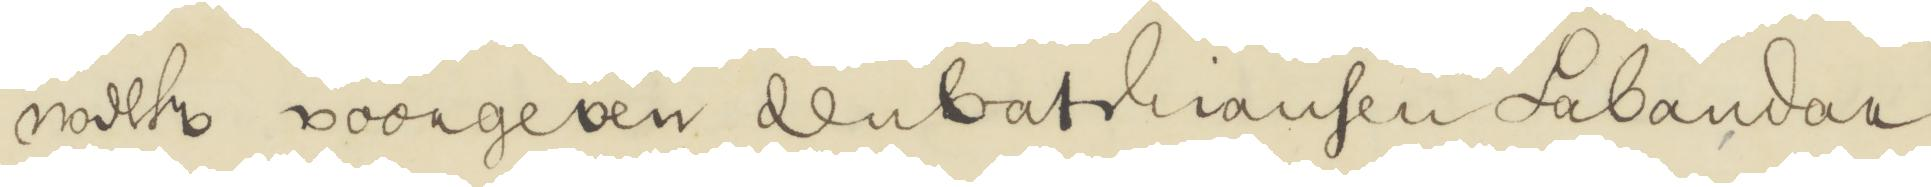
welk voorgeven den batchiansen Sabandar
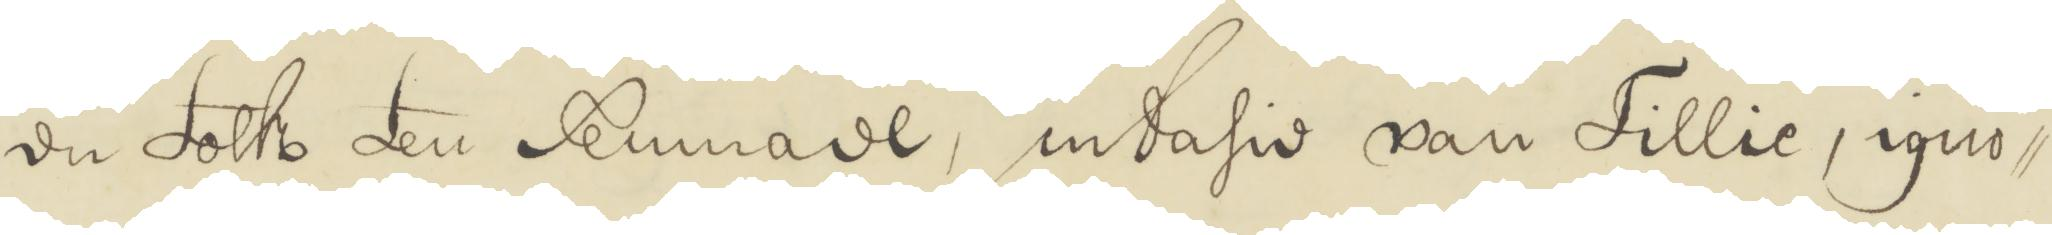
en tolk ten Eenmael, infasie van Tillie, igno„
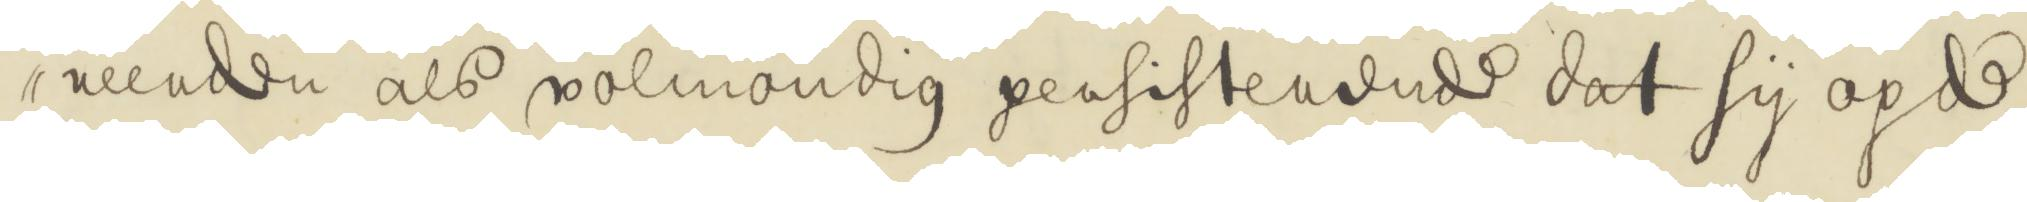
„reerden als volmondig persisterende dat sij op de
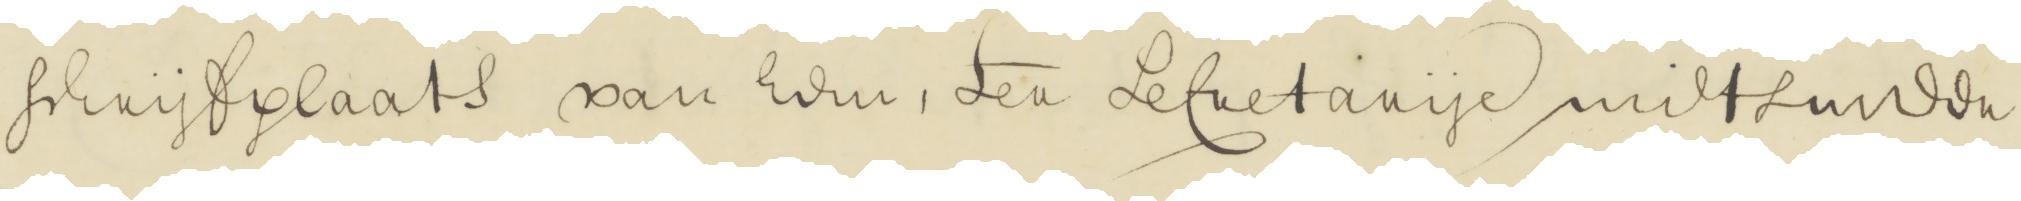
schrijfplaats van hem, ter secretarije niets meer
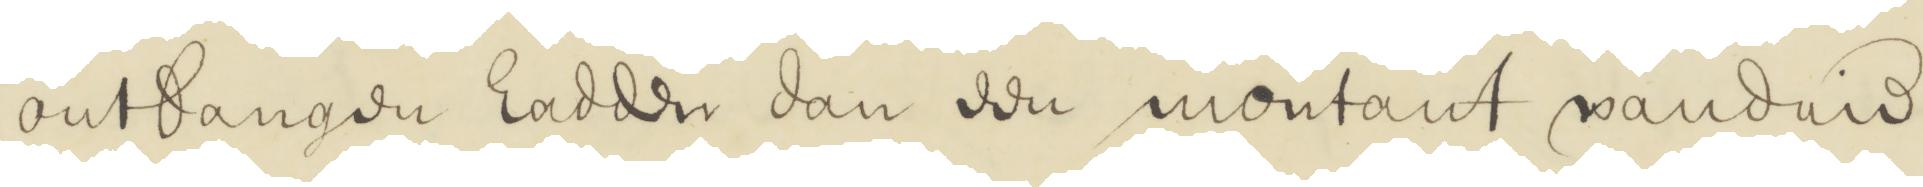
ontfangen hadden dan een montant van drie
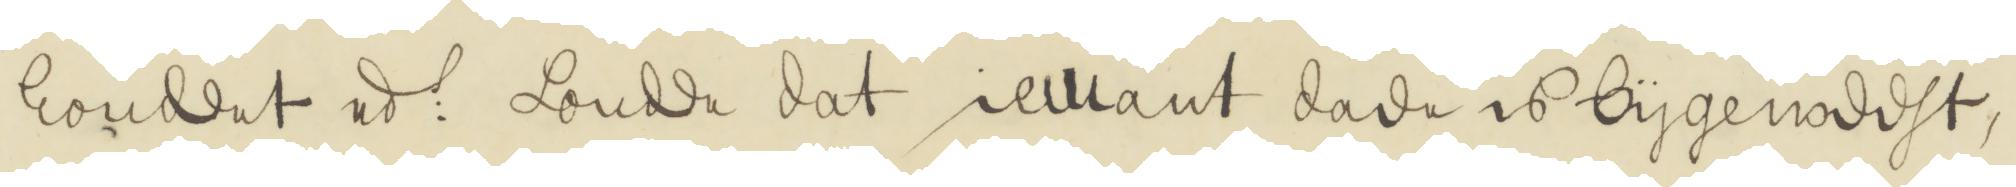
hondert rd:s sonder dat iemant daer is bij geweest,
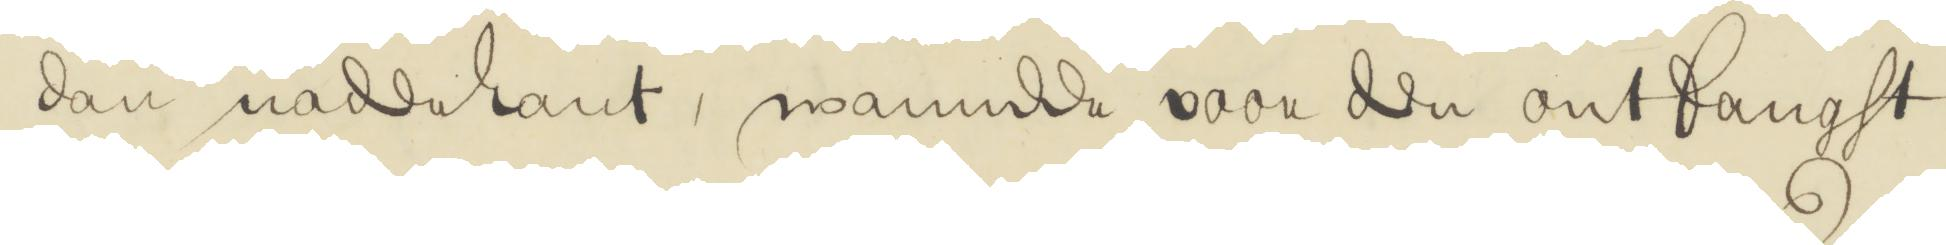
dan naderhant, wanneer voor den ontfangst
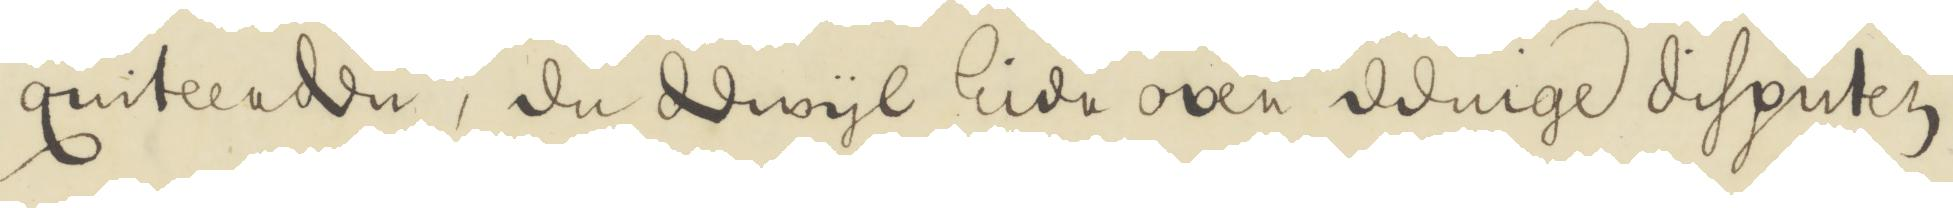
quiteerden; en dewijl hier over eenige disputen
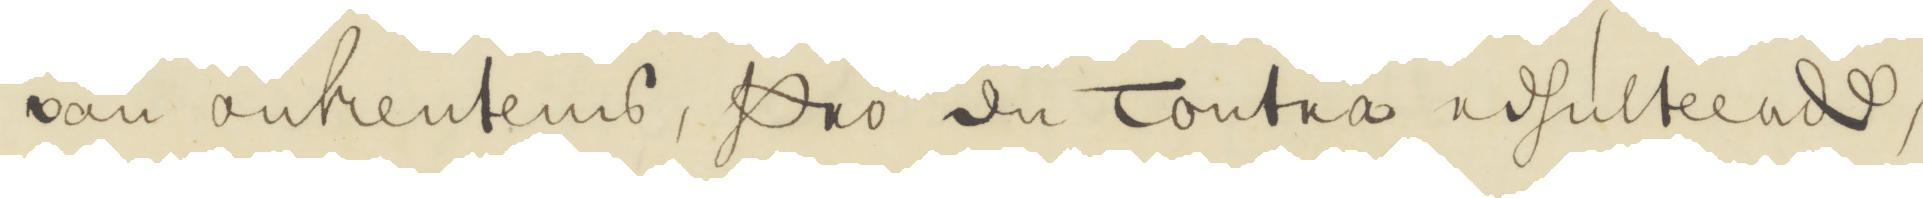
van onkentenis, pro en contra resulteerde
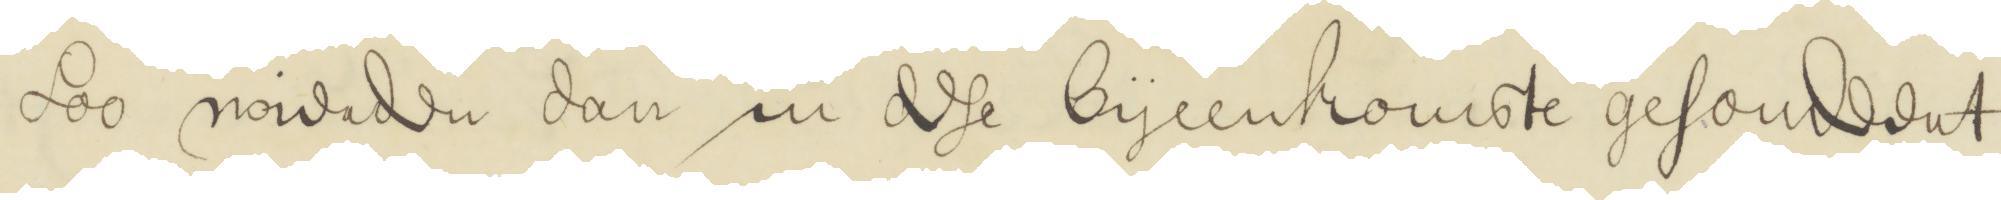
soo wierden dan in dese bijeenkomste gesondeert
